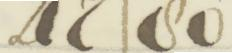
ƒ 47 80
